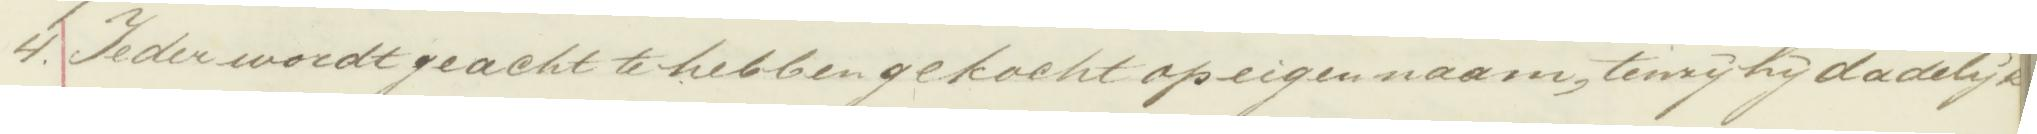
4. Ieder wordt geacht te hebben gekocht op eigen naam, tenzij hij dadelijk
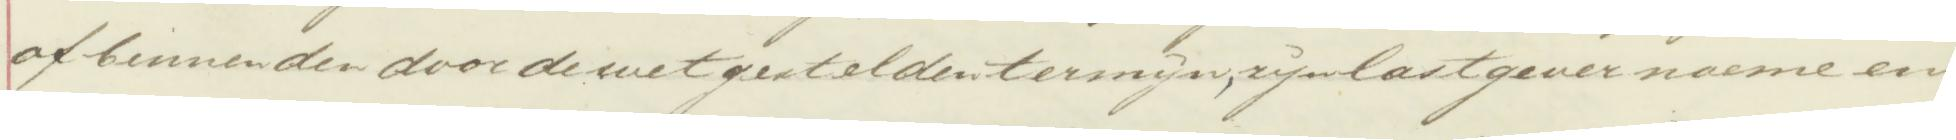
of binnen der door de wet gestelden termijn, zijn lastgever noeme en
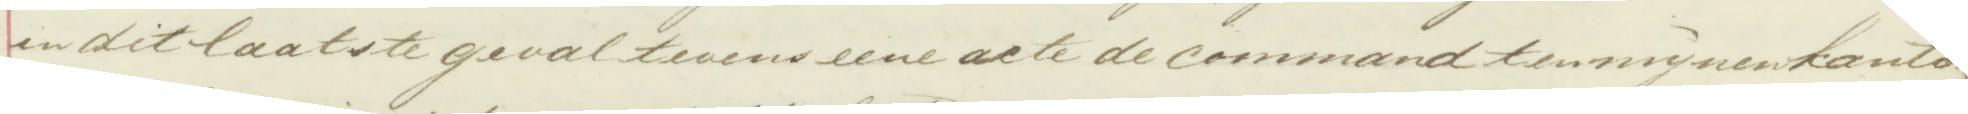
in dit laatste geval tevens eene acte de command ten mijnen kanto
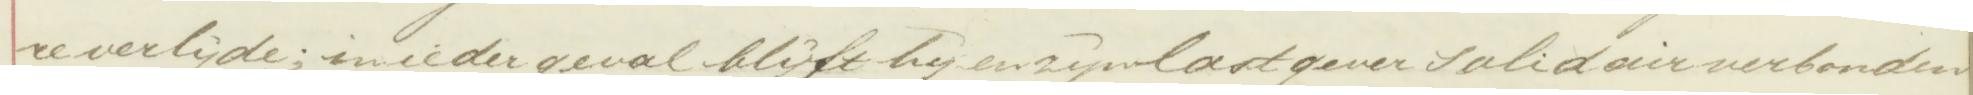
re verlijde; in ieder geval blijft hij en zijn last gever solidair verbonden
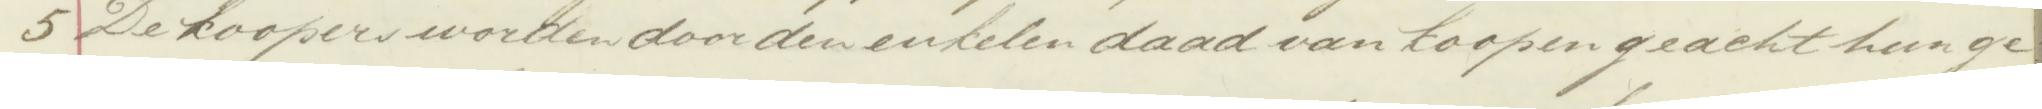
5 De koopers worden door den enkelen daad van koopen geacht hun ge
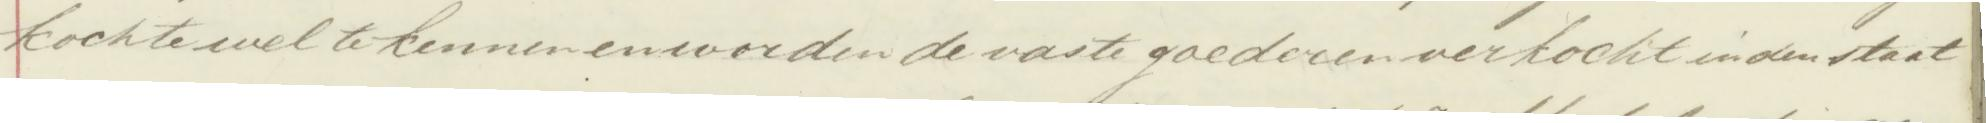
kochte wel te kennen en worden de vaste goederen verkocht in den staat
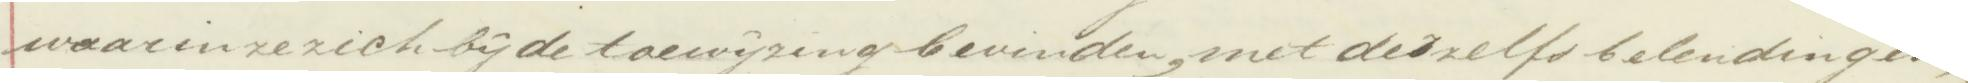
waarin ze zich bij de toewijzing bevinden, met deszelfs belendingen,
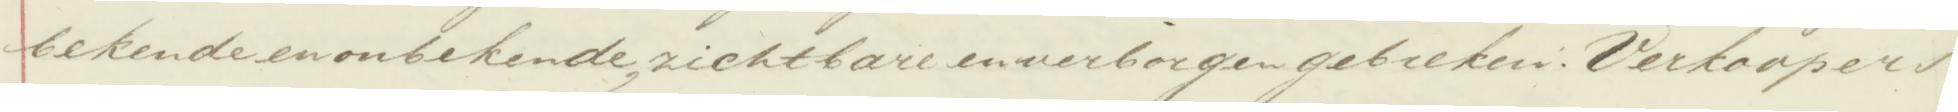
bekende en onbekende, zichtbare en verborgen gebreken: Verkoopers
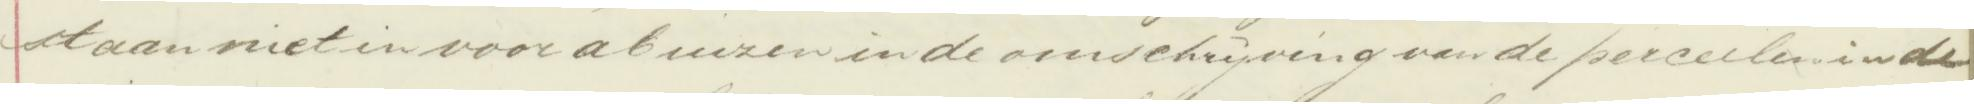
staan niet in voor abuizen in de omschrijving van de perceelen in de
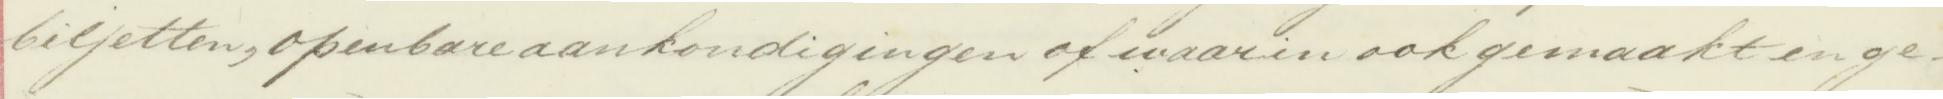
biljetten, openbare aankondigingen of waarin ook gemaakt en ge
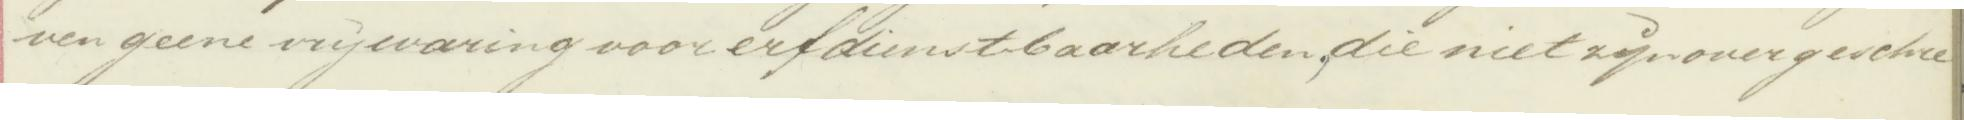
ven geene vrijwaring voor erfdienstbaarheden, die niet zijn overgeschre
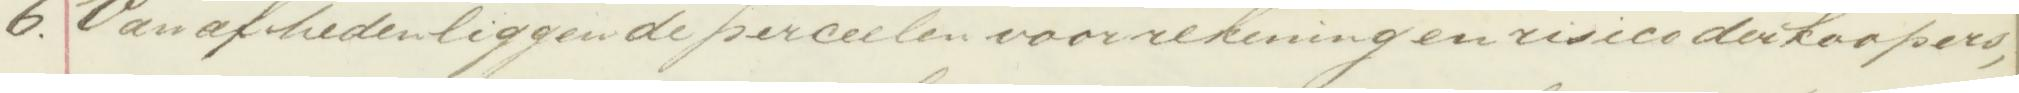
6. Van af heden liggen de perceelen voor rekening en risico der koopers,
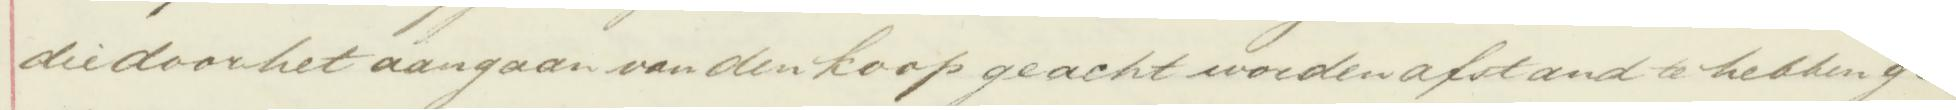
die door het aangaan van den koop geacht worden afstand te hebben ge
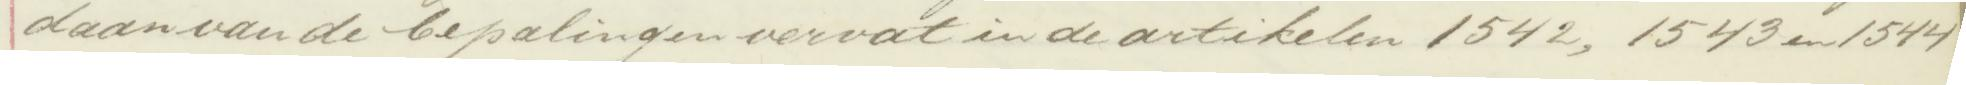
daan van de bepalingen vervat in de artikelen 1542, 1543 en 1544
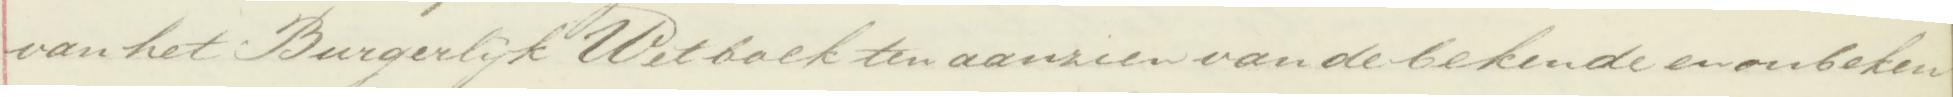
van het Burgerlijk Wetboek ten aanzien van de bekende en onbeken
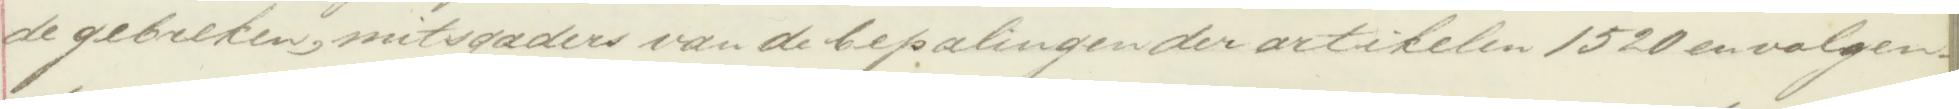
de gebreken, mitsgaders van de bepalingen der artikelen 1520 en volgen-
